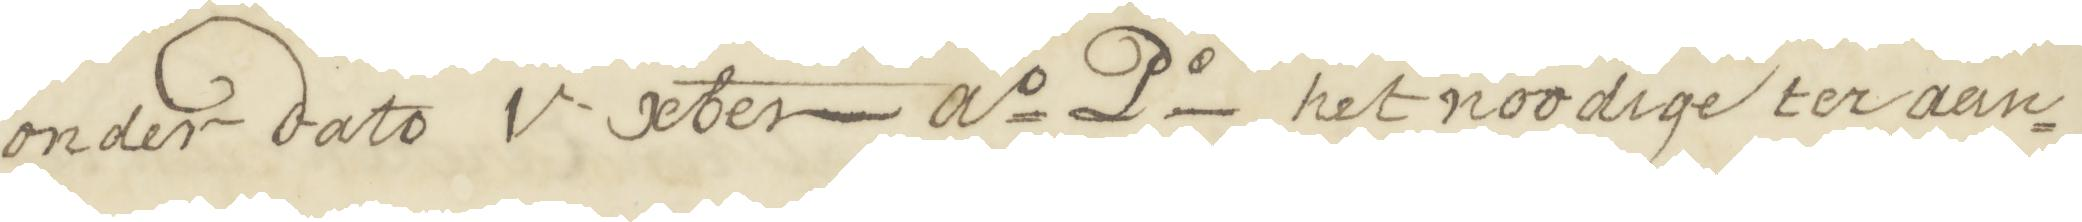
onder dato 1:e xber a=o P-o het noodige ter aan„
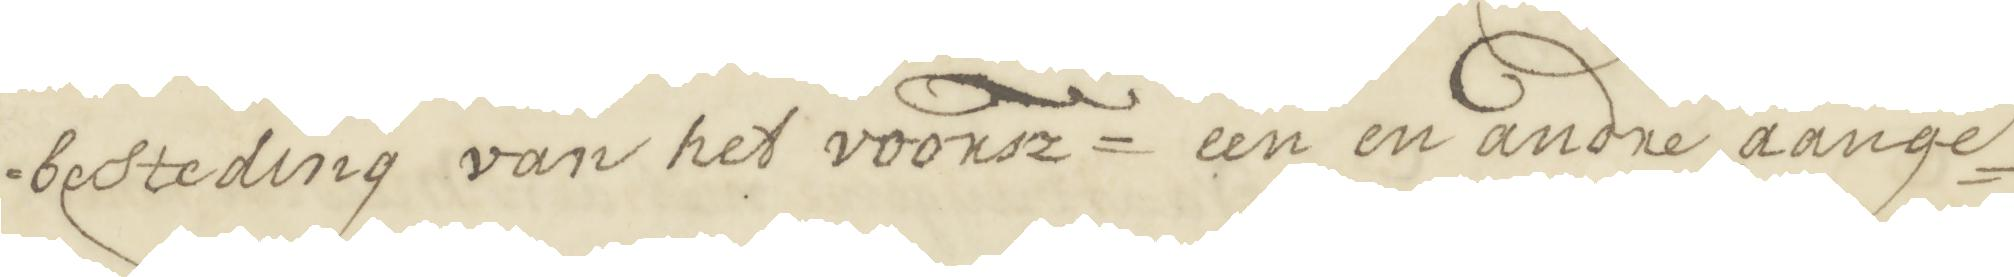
„besteding van het voorsz=e een en andre aange„
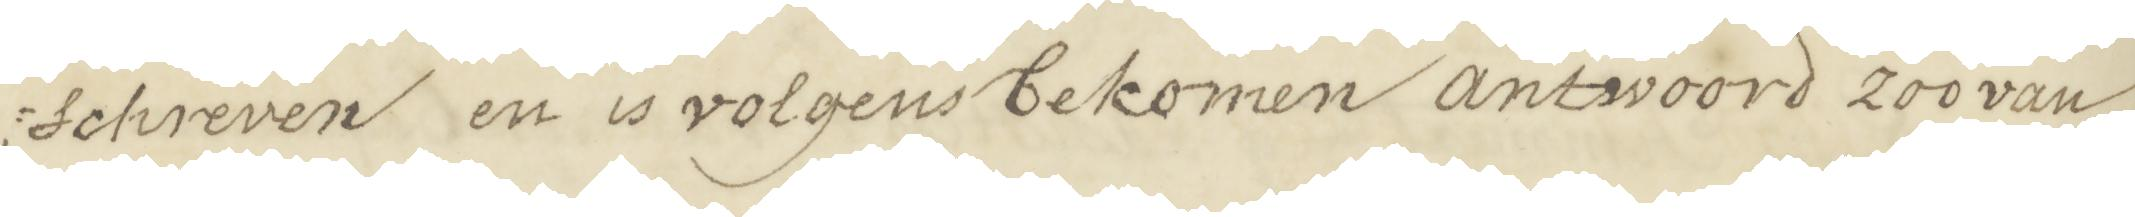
„schreven en is volgens bekomen antwoord zoo van
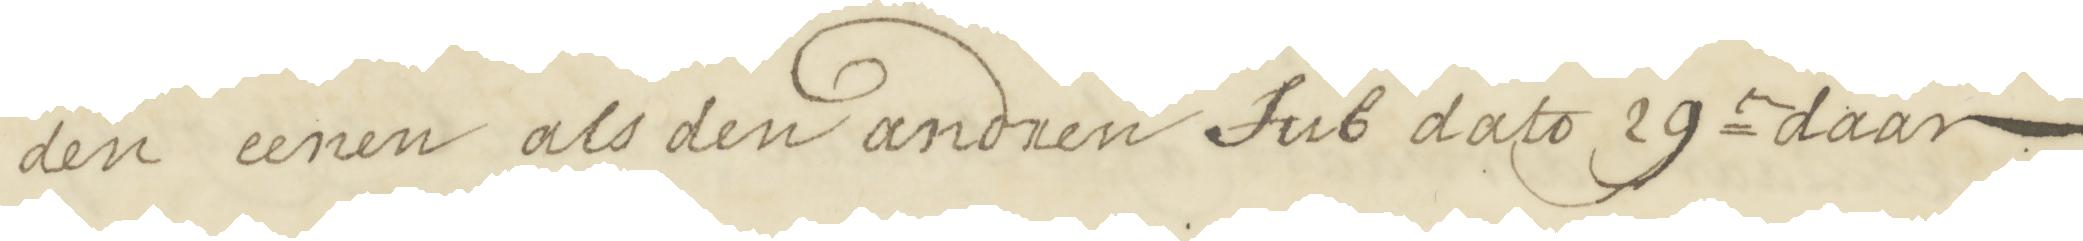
den eenen als den andren Sub dato 29=' daar
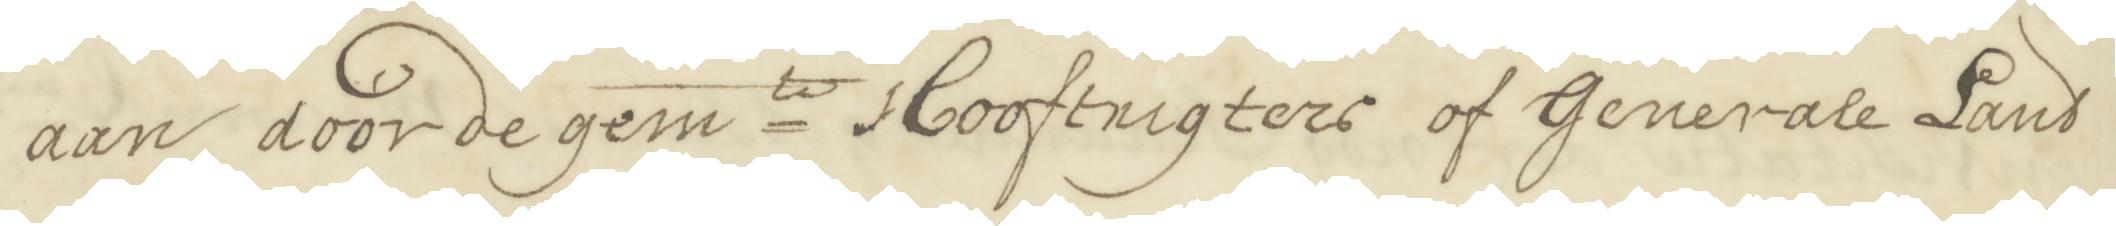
aan door de gem=te Hooftrigters of Generale Lant
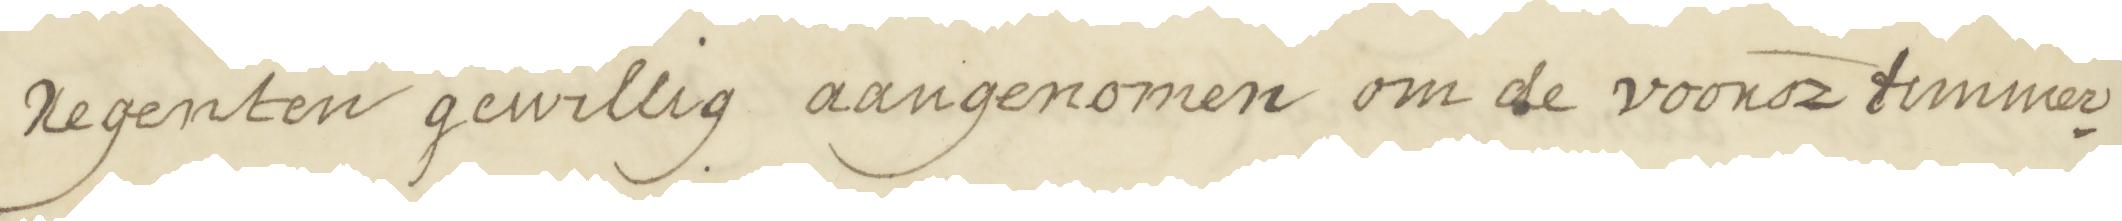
regenten gewillig aangenomen om de voorsz timmer
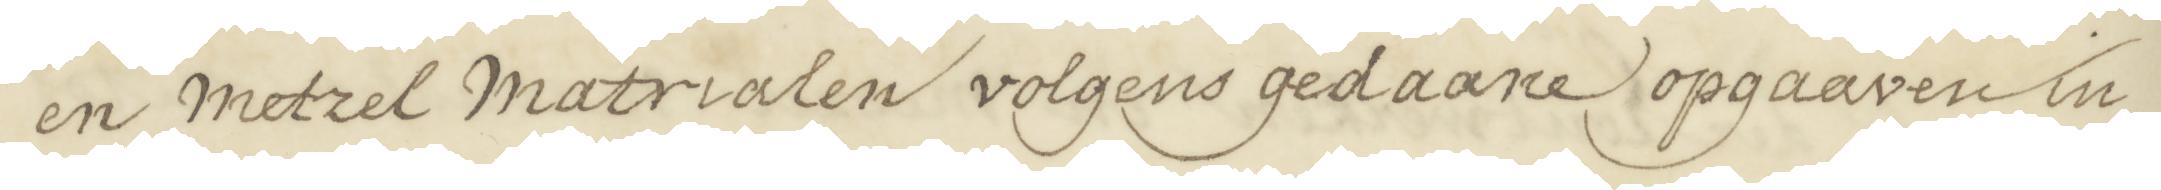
en metzel matrialen volgens gedaane opgaaven in
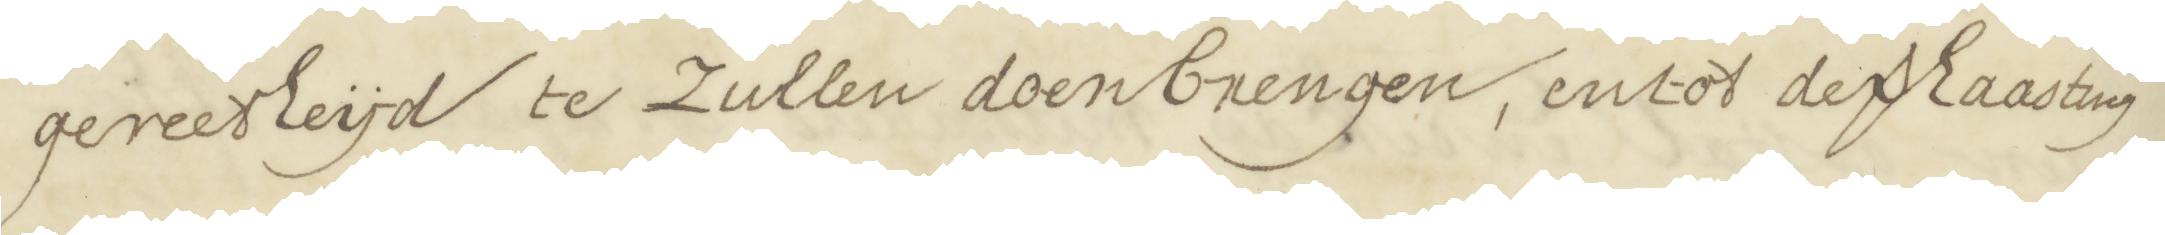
gereetheijd te Zullen doen brengen, en tot de verhaasting
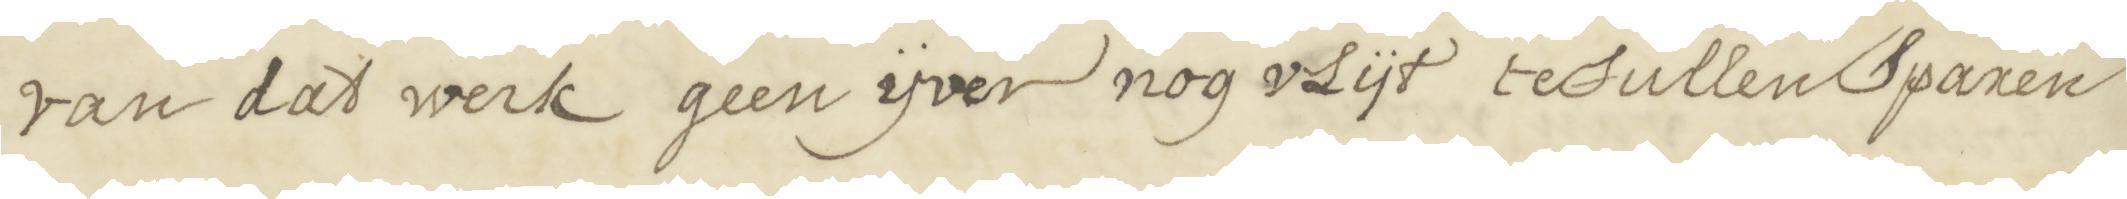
van dat werk geen ijver nog vlijt te sullen Sparen
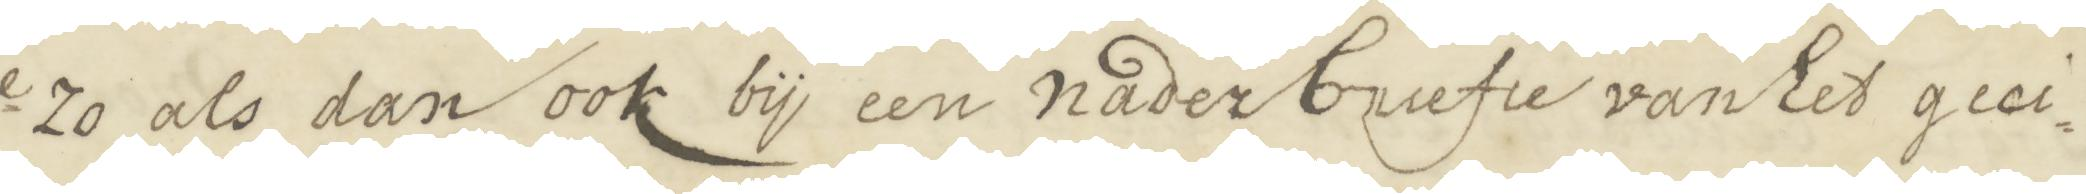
zo als dan ook bij een nader briefie van het geci„
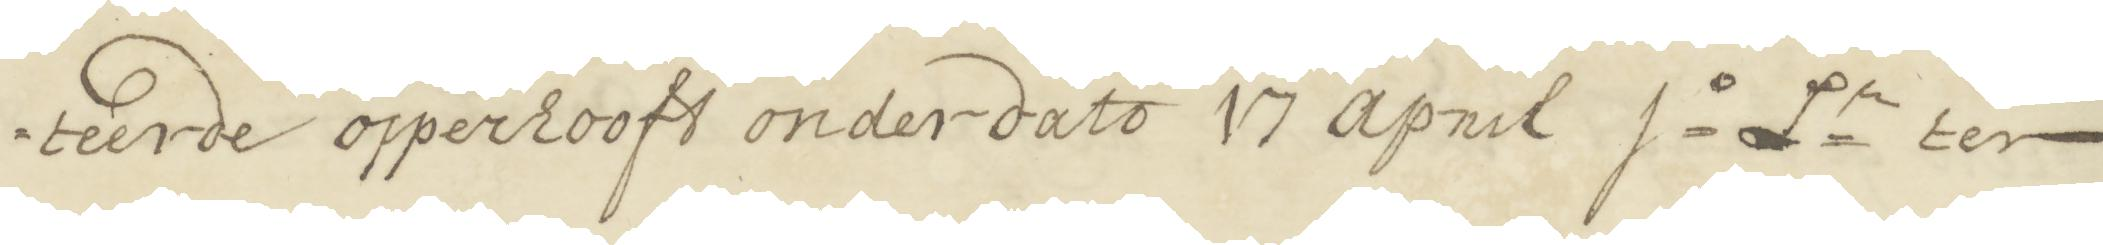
„teerde opperhooft onder dato 17 April j=o L=n ter
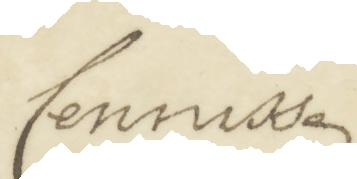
Cennissen
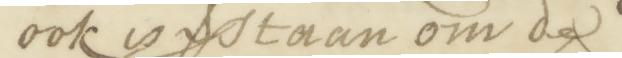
ook is verstaan om de
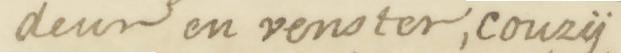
deur en venster, couzij
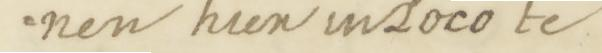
„nen hier in Loco te
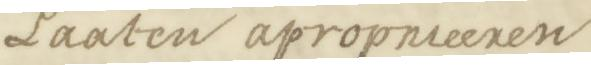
Laaten aproprieeren
